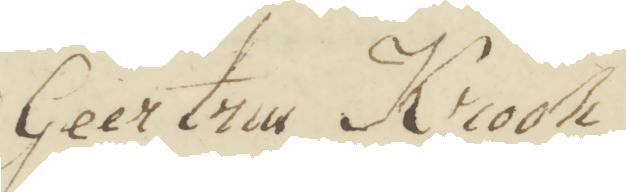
Geertrui Krook
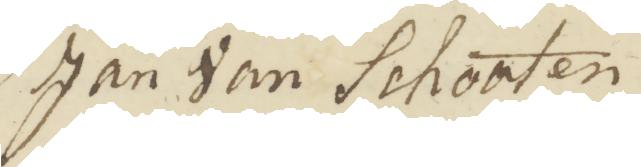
Jan Van Schooten
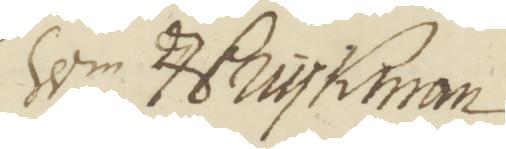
W-n Huijkman
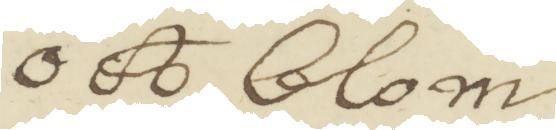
o A blom
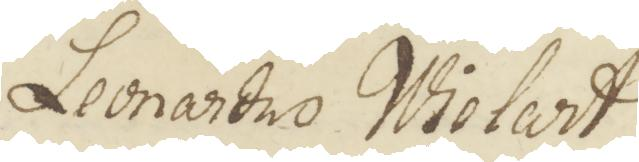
Leonardus Wiolart
